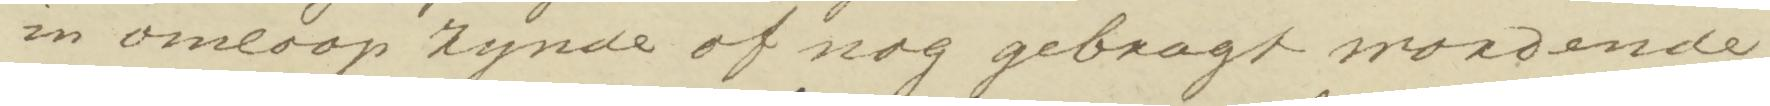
in omloop zynde of nog gebragt wordende.
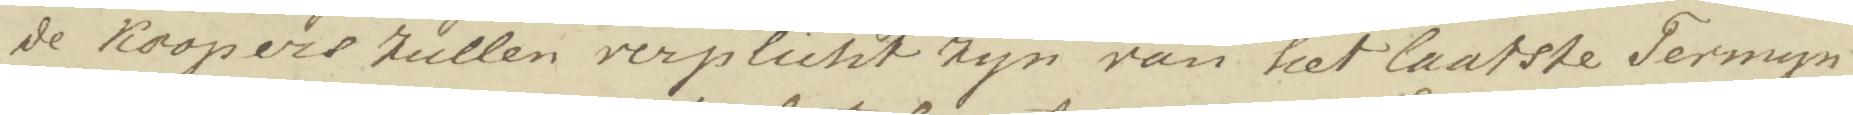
de koopers zullen verplicht zyn van het laatste Termyn
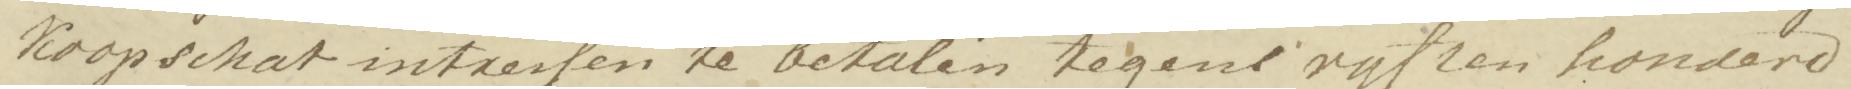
koopschat intressen te betalen tegens vyf ten honderd
